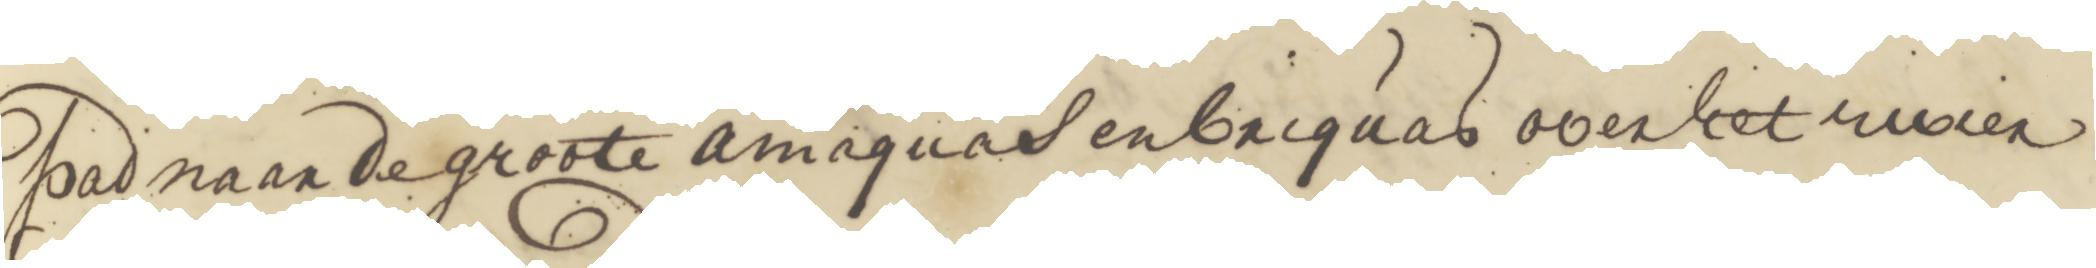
pad naar de groote amaquas en briquas over het rivier
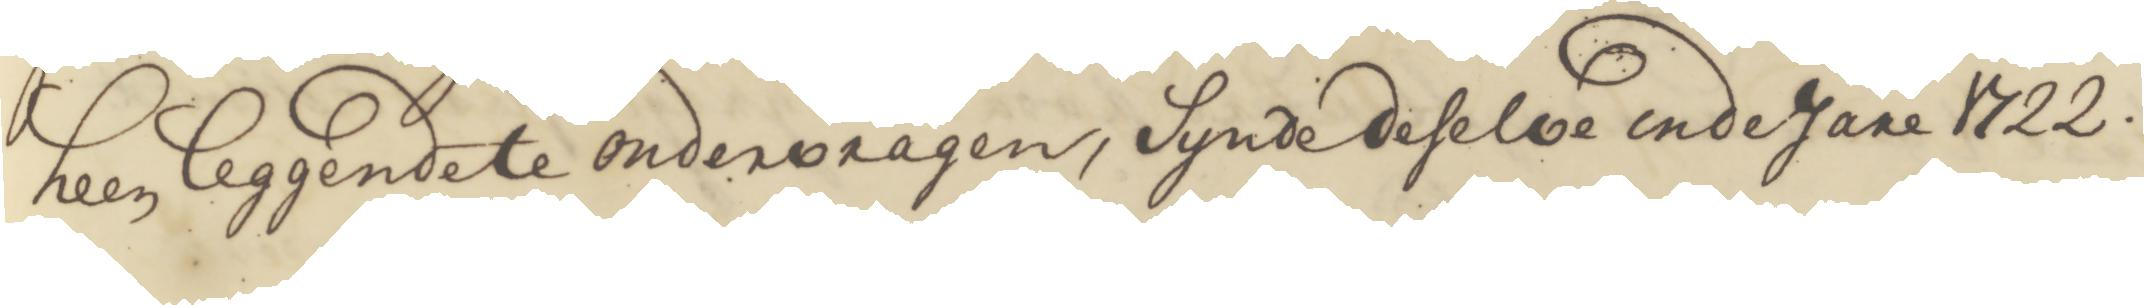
heen leggende te ondervragen, synde deselve in de Jare 1722
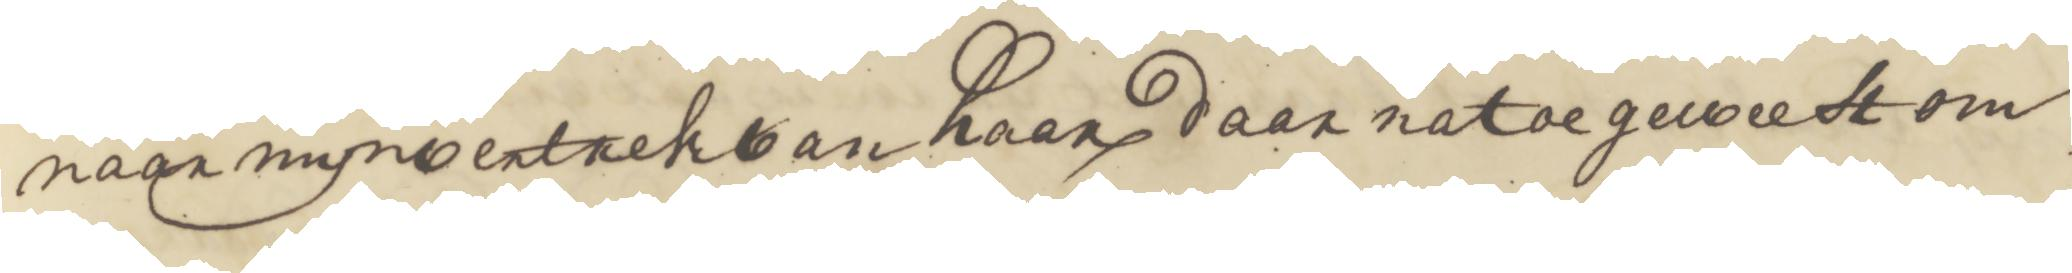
naar myn vertrek van haar daar natoe geweest om
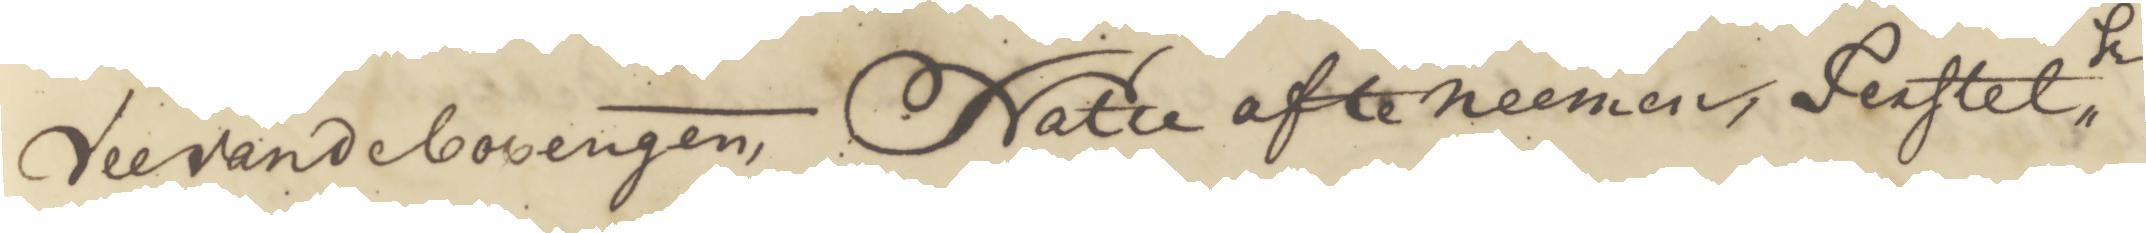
vee vande bovengen, Natie afte neemen, Eerstel„k
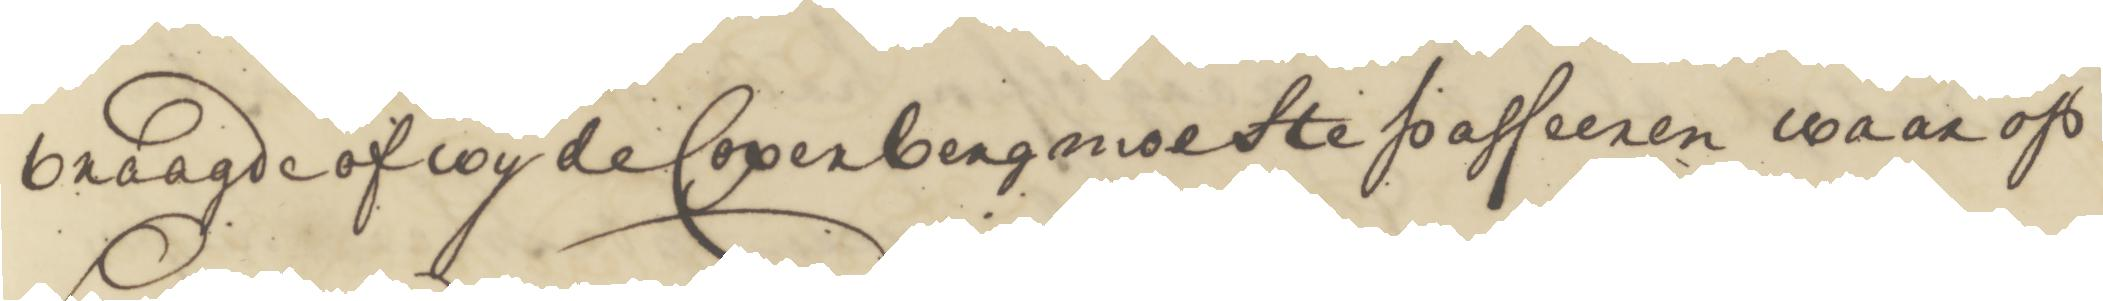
vraagde of wy de Coperberg moeste passeeren waar op
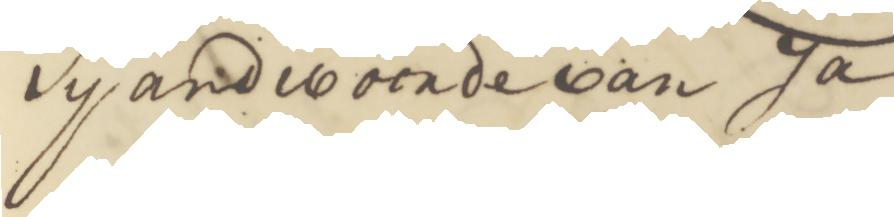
Sy andwoorde van Ja
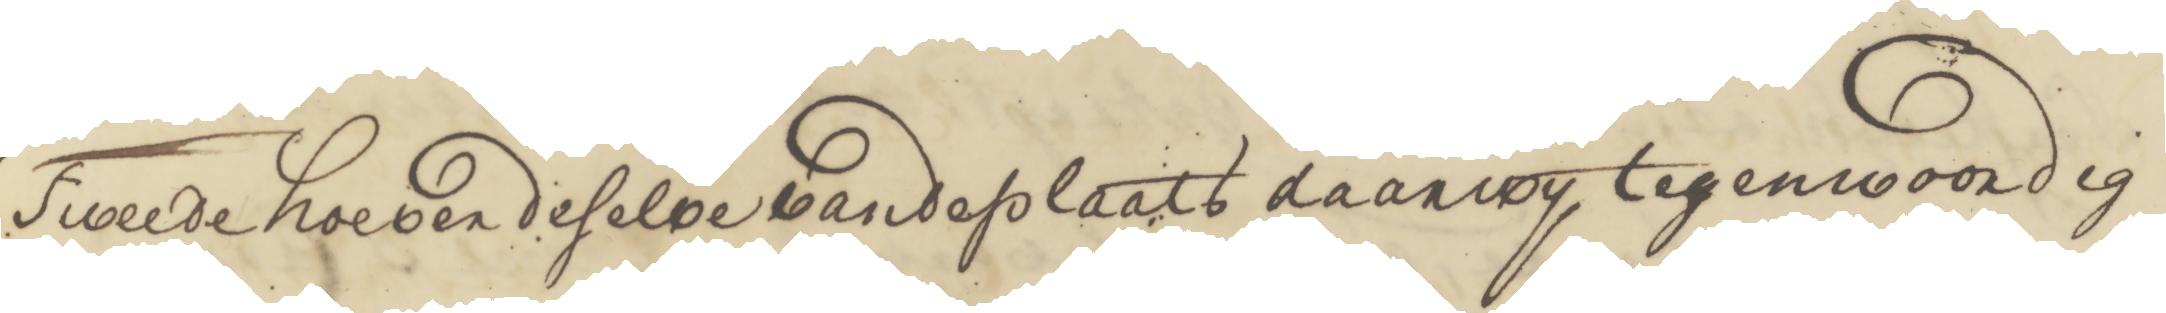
Tweede hoever deselve van de plaats daar wy tegenwoordig
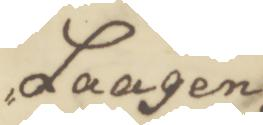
Laagen
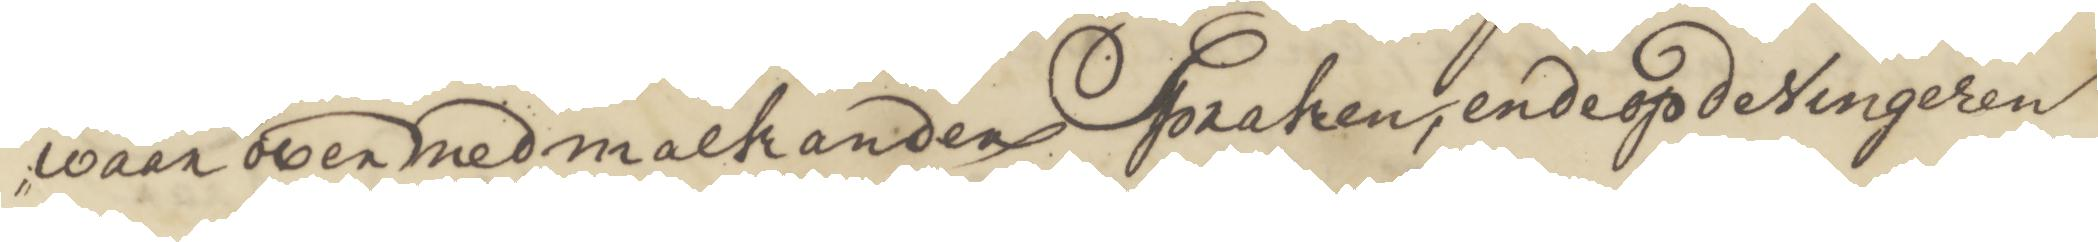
„waar over med malkander Spraken, ende op de vingeren
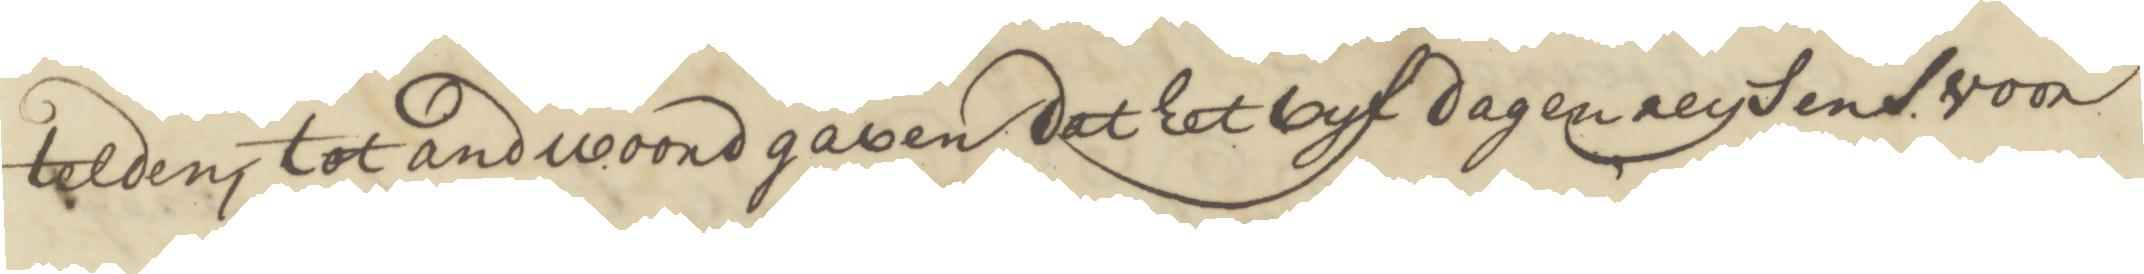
telden, tot andwoord gaven dat het vyf dagen reysens voor
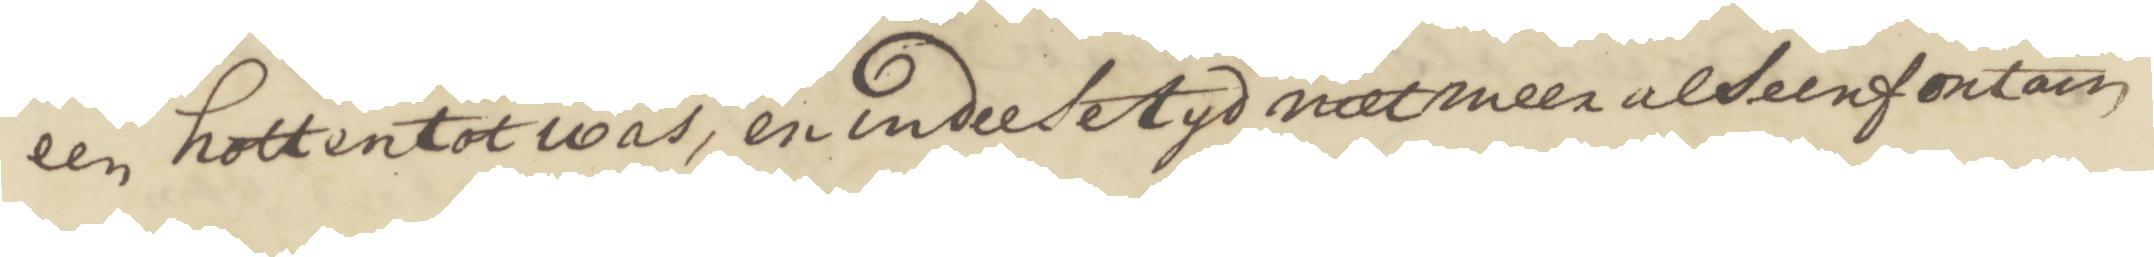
een hottentot was, en indeese tyd niet meer als een fontain
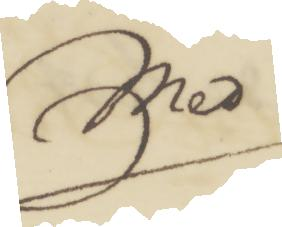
Med
